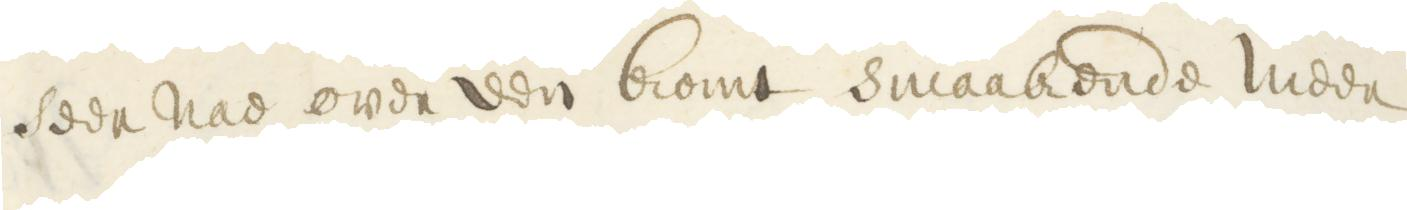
seer nae over een komt smaakende meer
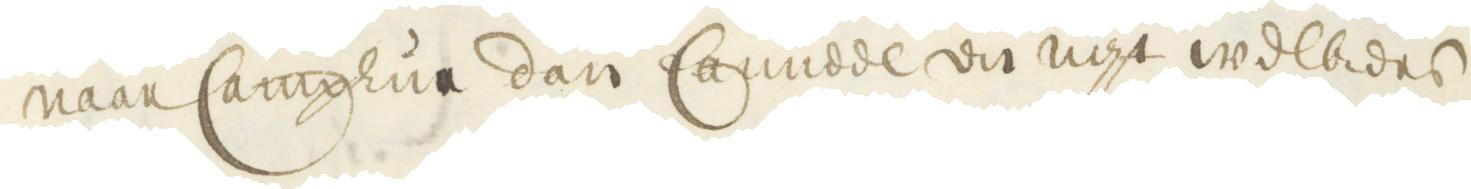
naar Camphur dan Canneel en uijt welkers
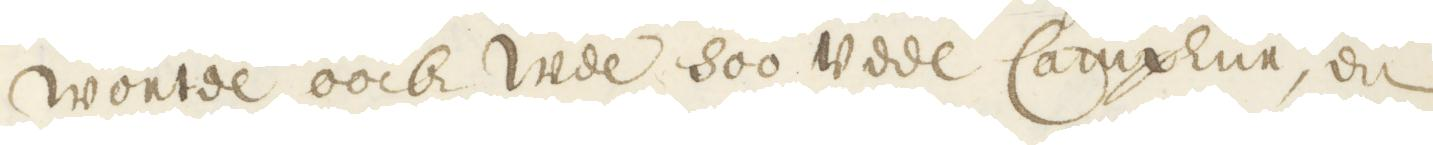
wortel oock wel soo veel Camphur, en
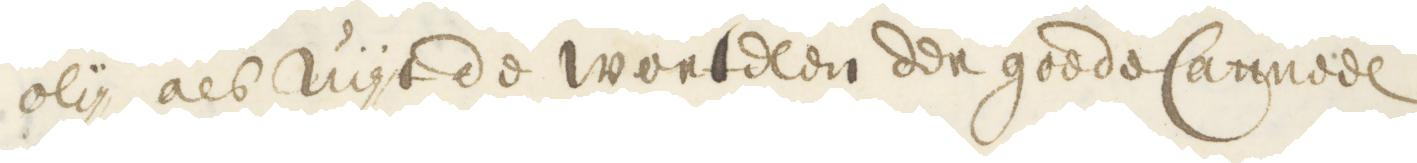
olij als uijt de wortelen der goede Canneel
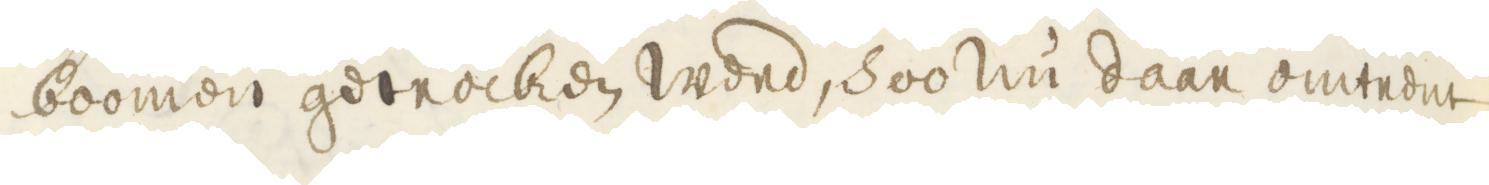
boomen getrocken werd, soo nu daar omtrent
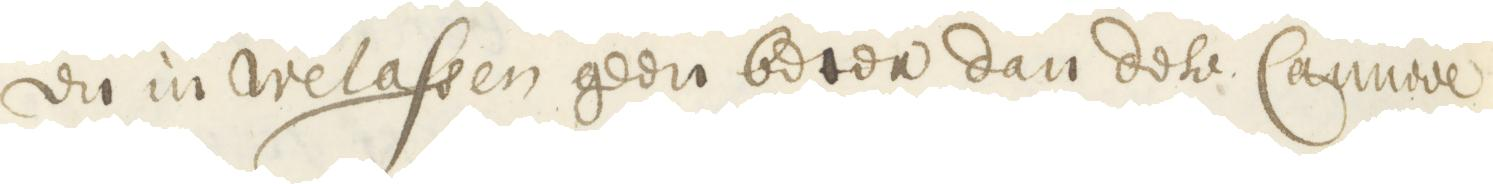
en in welassen geen beter dan dese Canneel
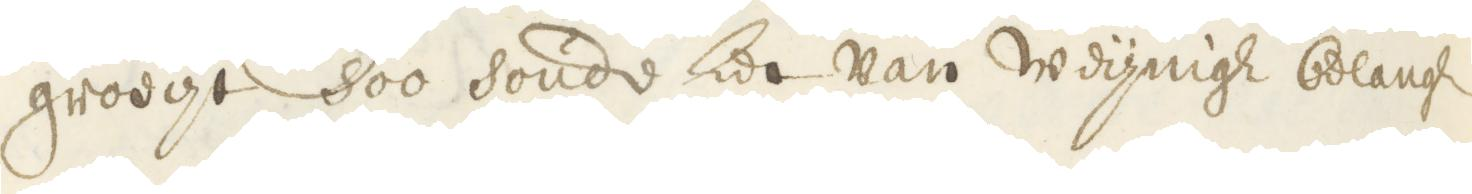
groeijt soo soude het van weijnigh belangh
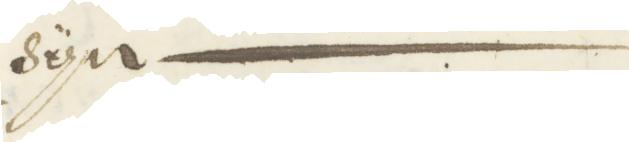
sijn —
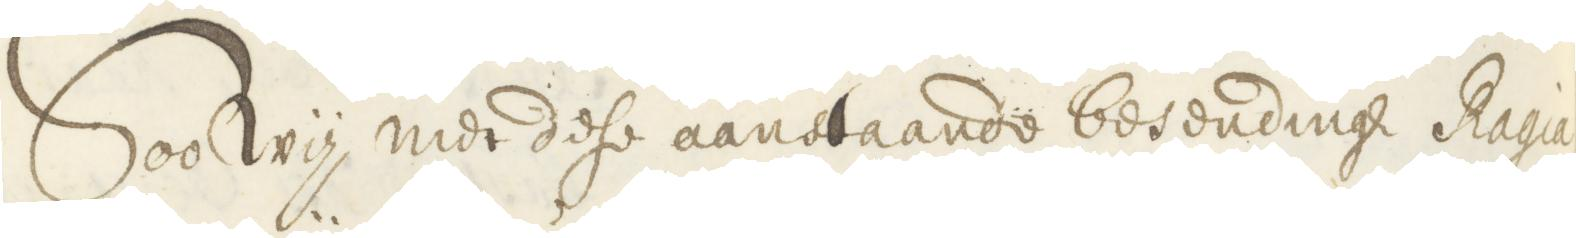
Soo wij met dese aanstaande besendingh Ragia
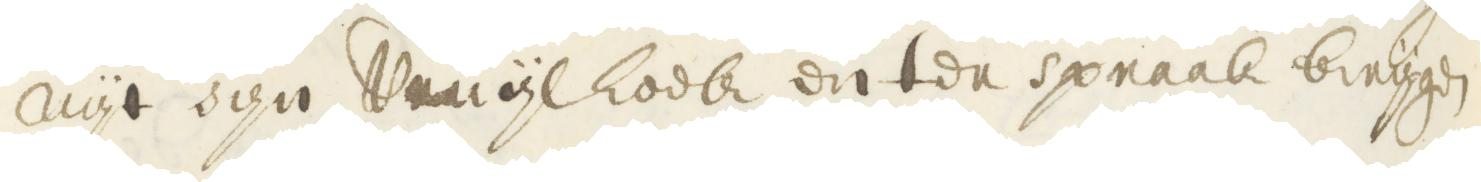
uijt sijn vruijlhoek en ter spraak krijgen
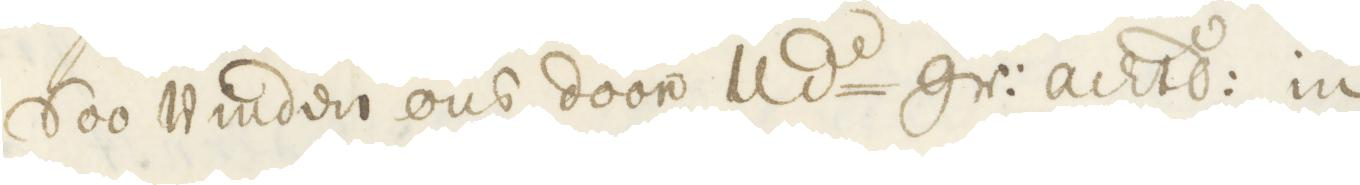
soo vinden ons door uE=e gr: achtb: in
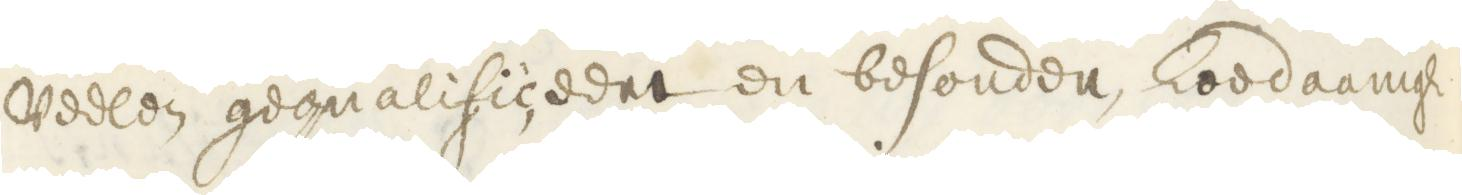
veelen gequalificeert en besonder, hoedaanigh
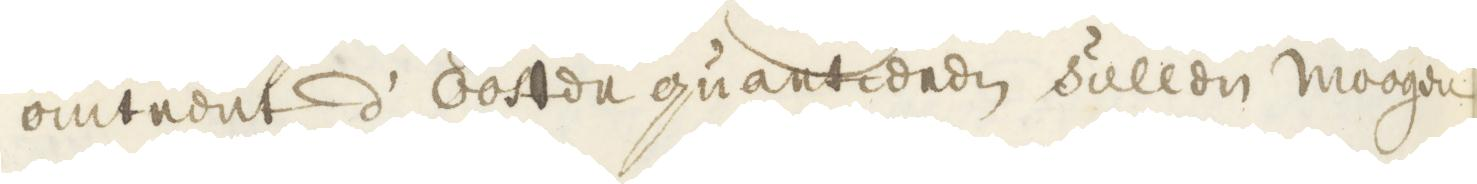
omtrent d’ ooster quartieren sullen moogen
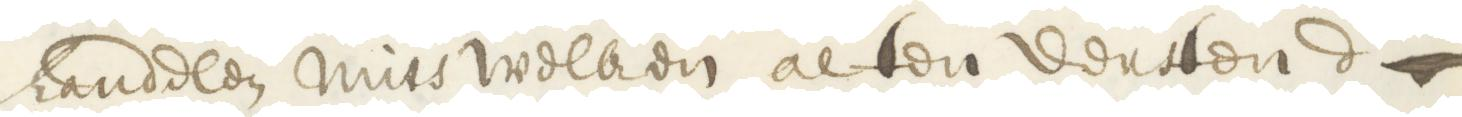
handelen mits welken alten versten d' —
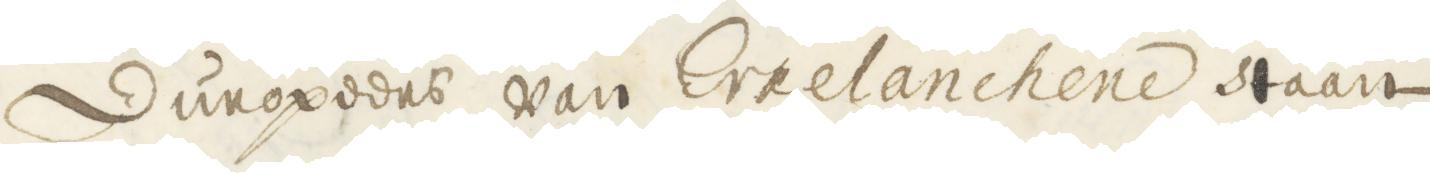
Europeers van Erkelanchene staan
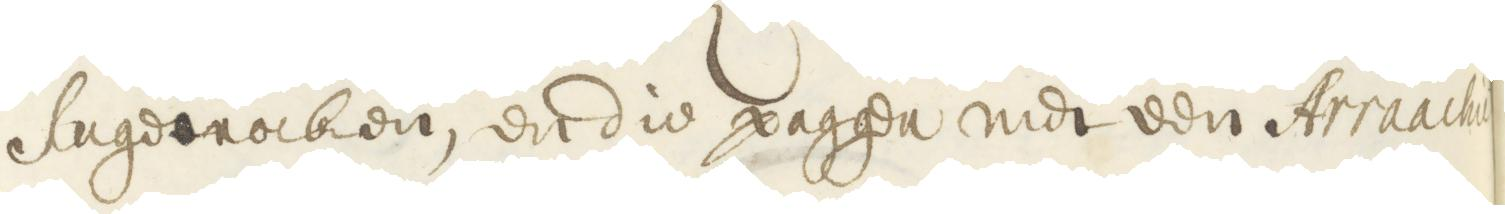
SIngetrocken, en die pagger met een Arraachu
